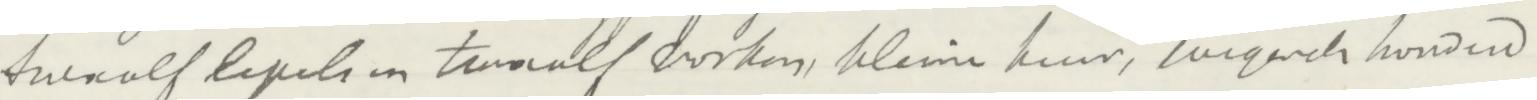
twaalf lepels en twaalf vorken, kleine keur, wegende honderd
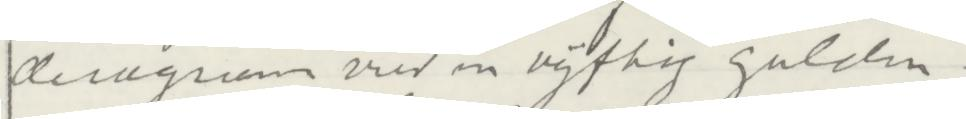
decagram vier en vijftig gulden
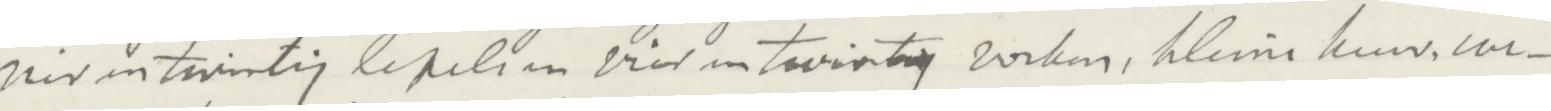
vier en twintig lepels en vorken, kleine keur, we-
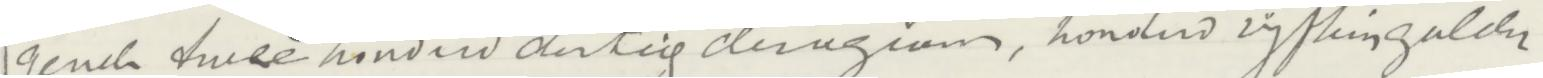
gende twee honderd dertig decagram, honderd vijftien gulden
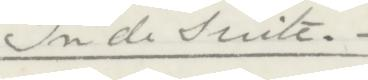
In de suite.
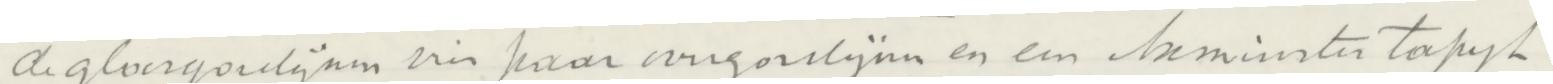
de glasgordijnen vier paar overgordijnen en een Axminster tapyt
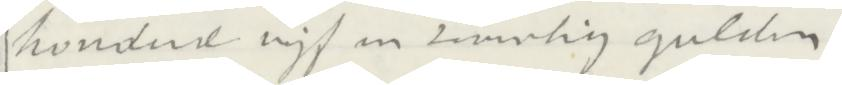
honderd vijf en zeventig gulden
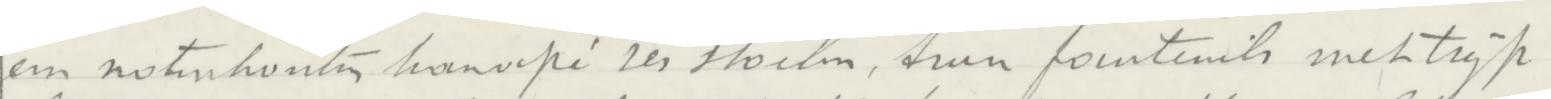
een notenhouten kanapé zes stoelen, twee fauteuils met trijp
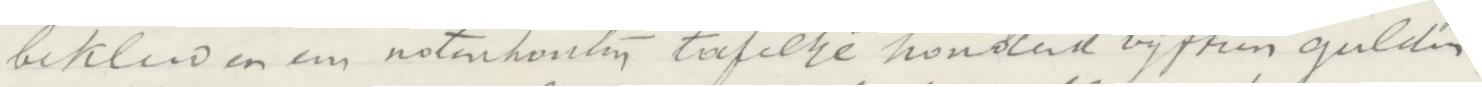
bekleed en een notenhouten tafeltje honderd vijftien gulden
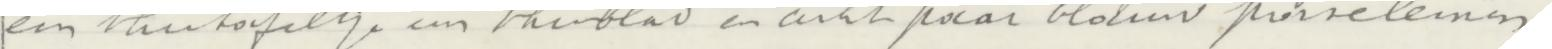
een theetafeltje een theeblad en acht paar blauw porseleinen
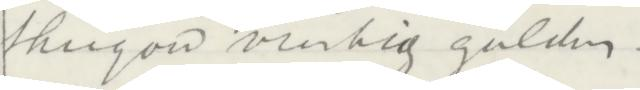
theegoed veertig gulden
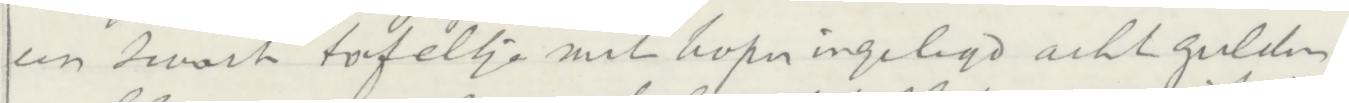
een zwart tafeltje met koper ingelegd acht gulden
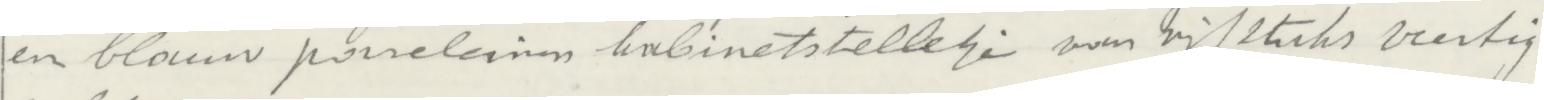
een blauw porseleinen kabinetstelletje van vijf stuks veertig
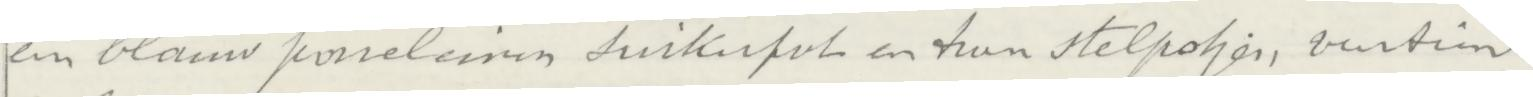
een blauw porseleinen suikerpot en tien stelpotjes, veertien
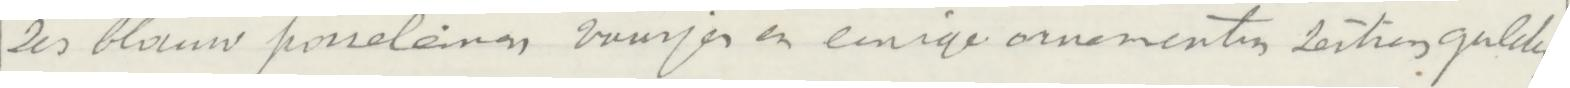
zes blauw porseleinen vaasjes en eenige ornementen zestien gulden
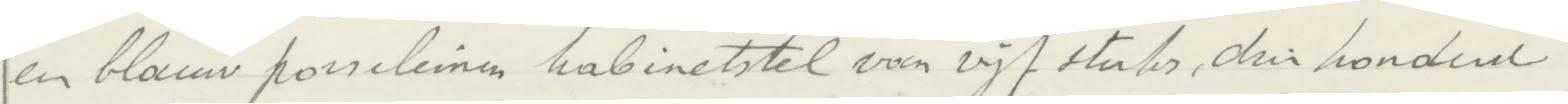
een blauw porseleinen kabinetstel van vijf stuks, drin honderd
